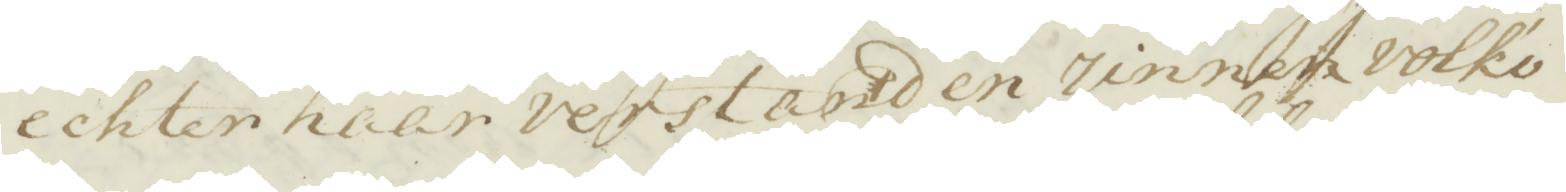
echter haar verstand en zinnen volko
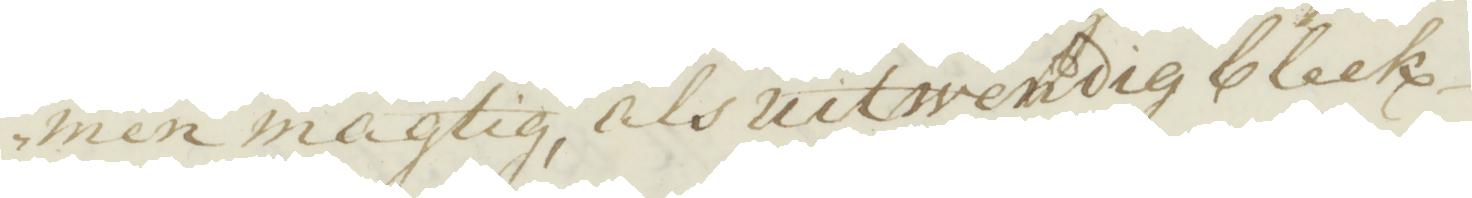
„men magtig, als uitwendig bleek
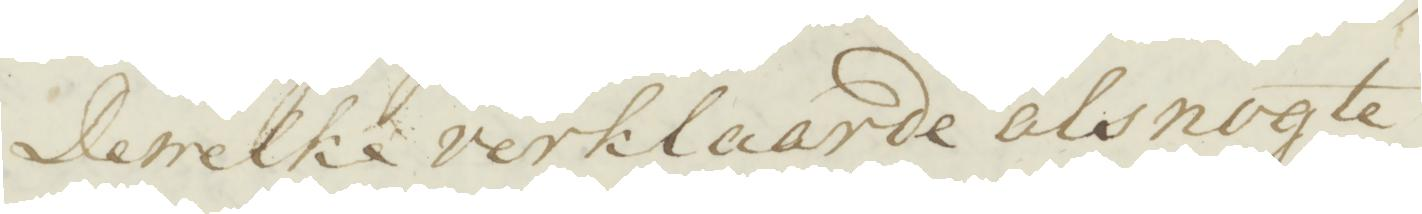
Dewelke verklaarde als nog te
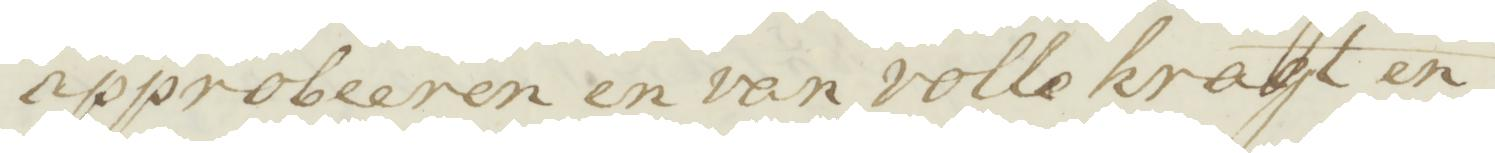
approbeeren en van volle kragt en
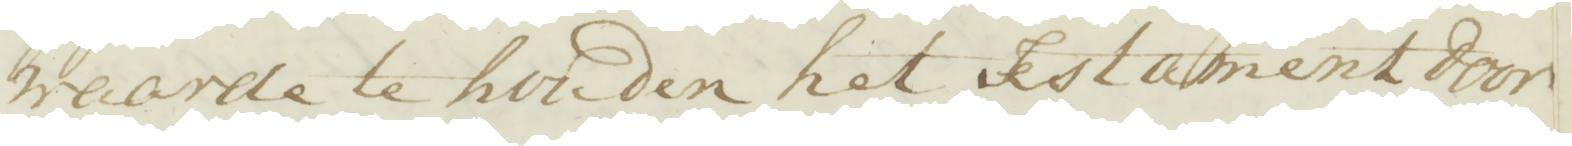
waarde te houden het Testament door
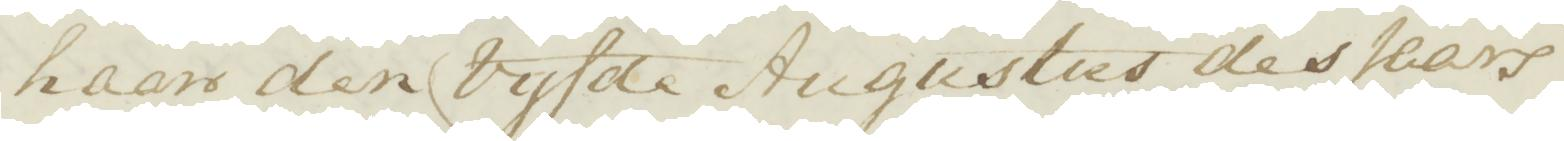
haar den Vyfde Augustus des Jaars
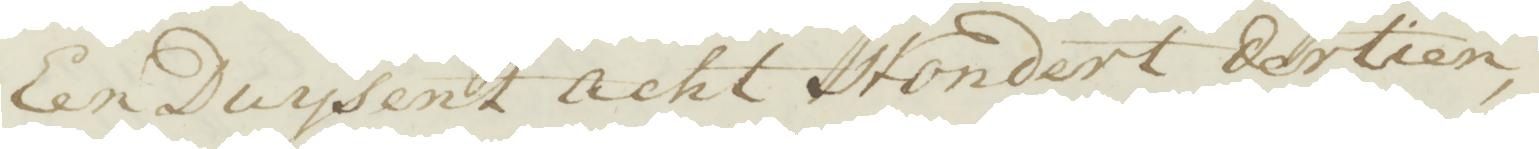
Een Duysent acht Hondert dertien,
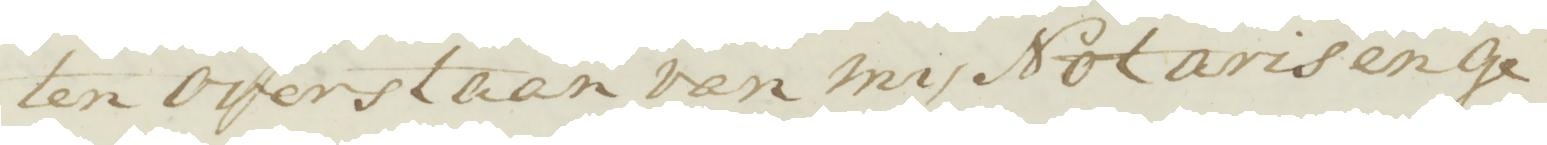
ten overstaan van mij Notaris en ge
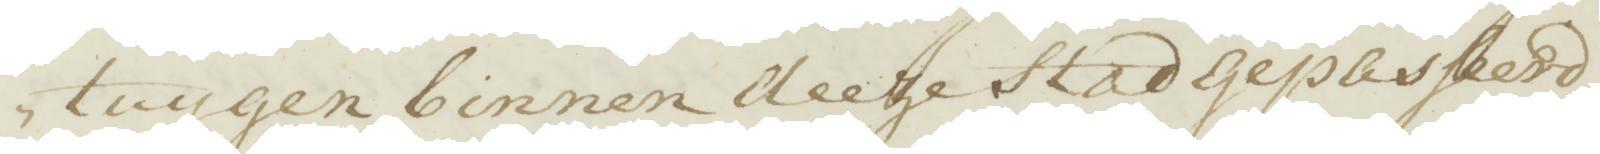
„tuijgen binnen deeze stad gepasseerd,
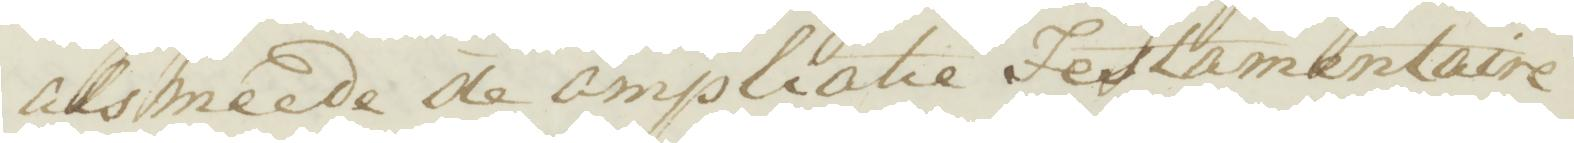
alsmeede de ampliatie Testamentaire
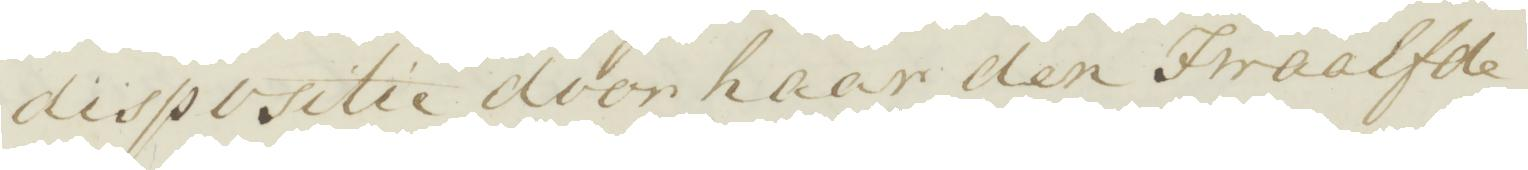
dispositie door haar den Twaalfde
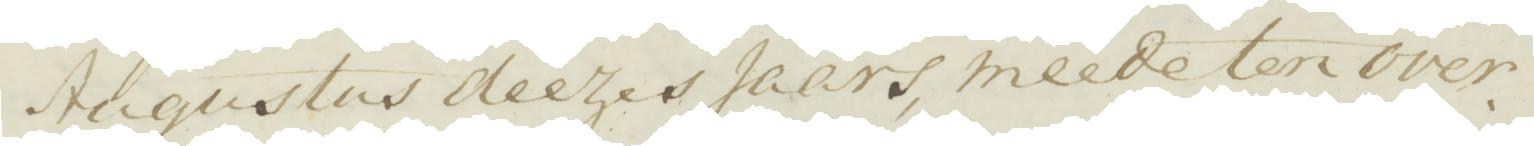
Augustus deezes jaars, meede ten over,
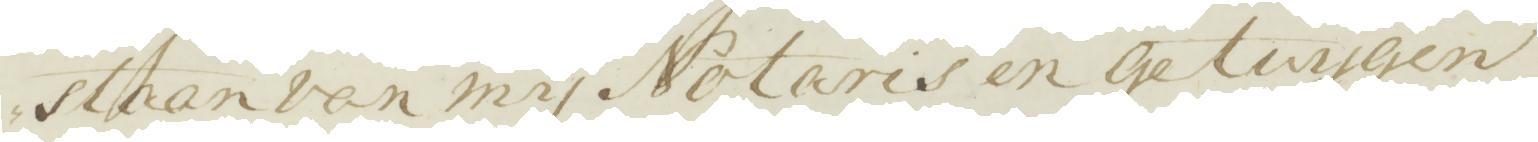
„staan van my Notaris en getuygen
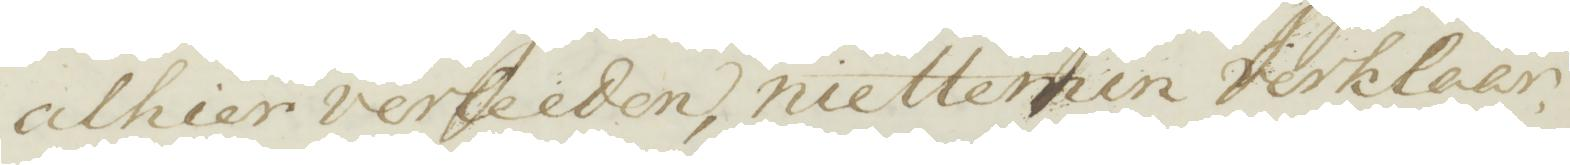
alhier verleeden, niettemin verklaar,
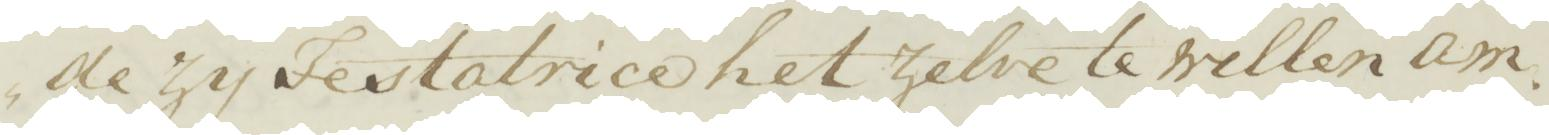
„de zy Testatrice het zelve te willen am,
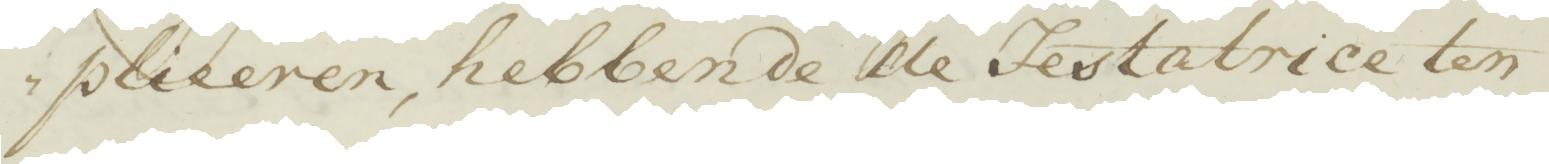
„plieeren, hebbende de Testatrice ten
